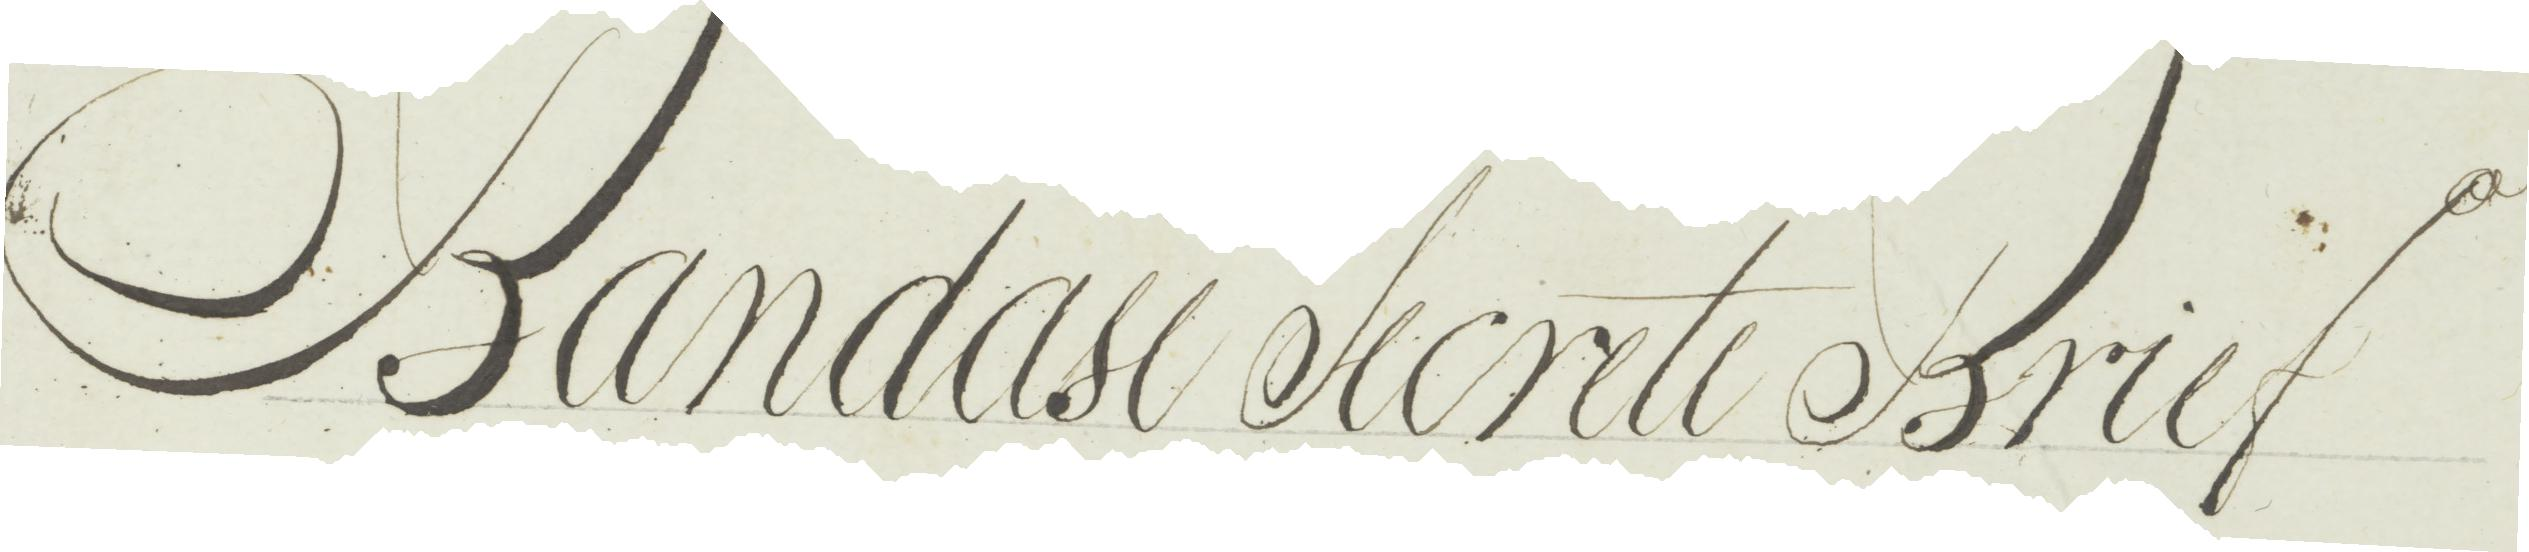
Bandase Secrete Brief
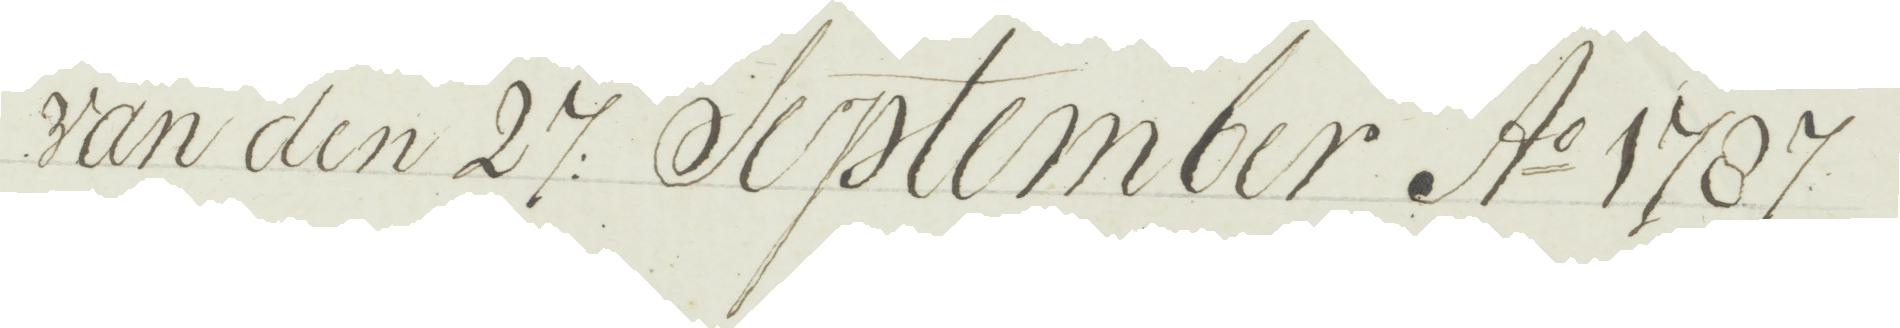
van den 27: September A-o 1787
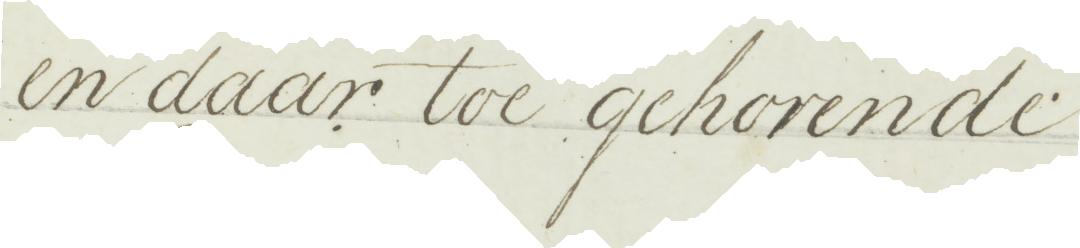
en daar toe gehorende
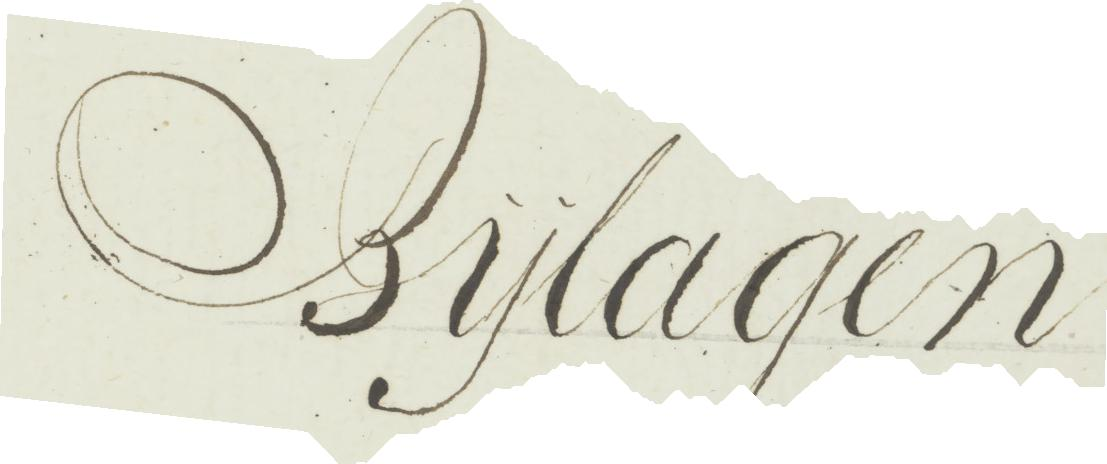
Bijlagen
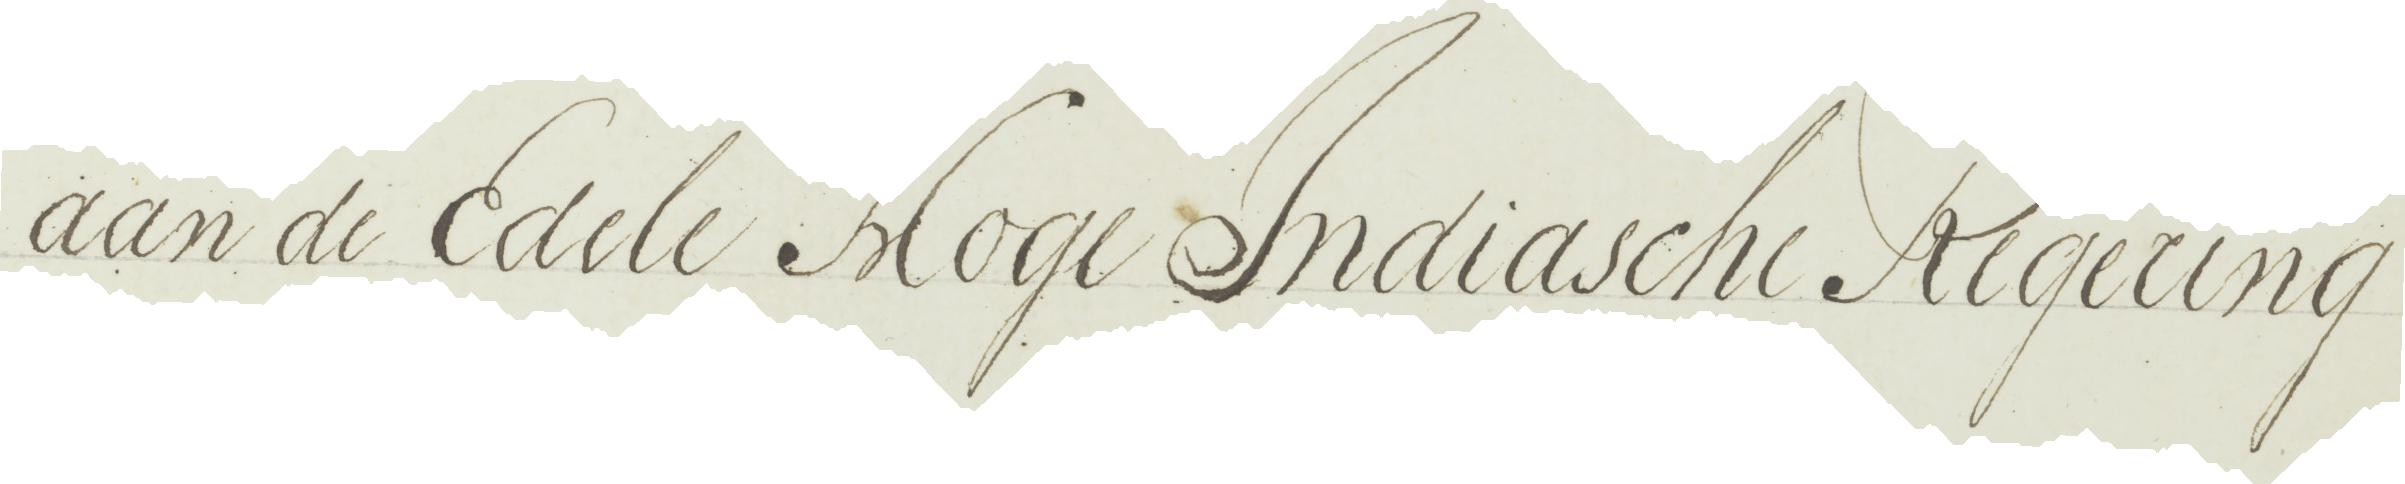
aan de Edele Hoge Indiasche Regering
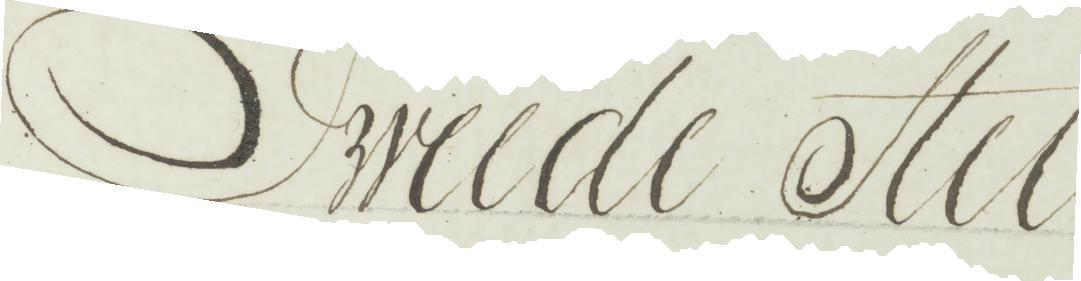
Tweede Stel
